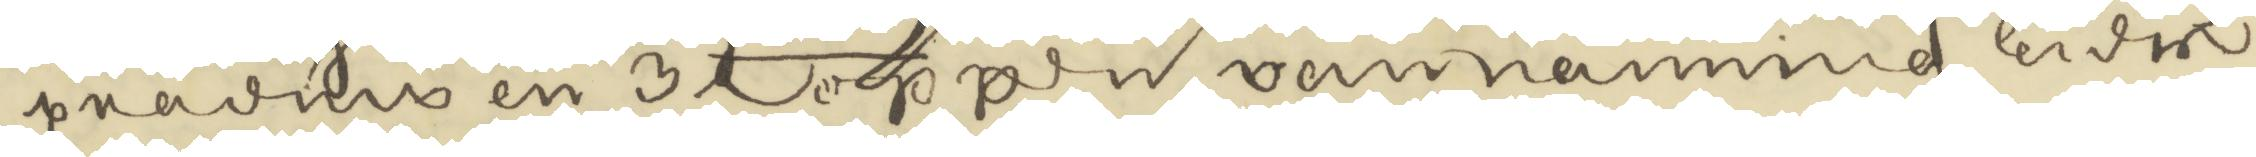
praeuw en 3 Coppen van nanning hiers
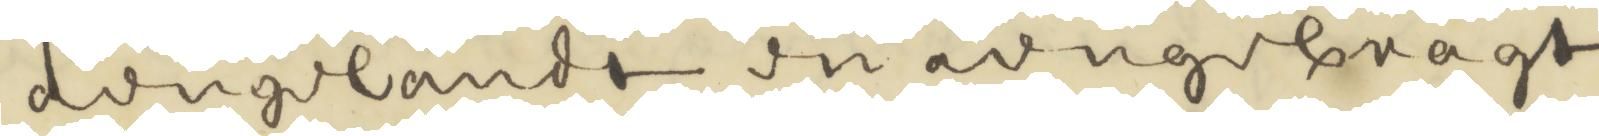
aengelandt en aengebragt
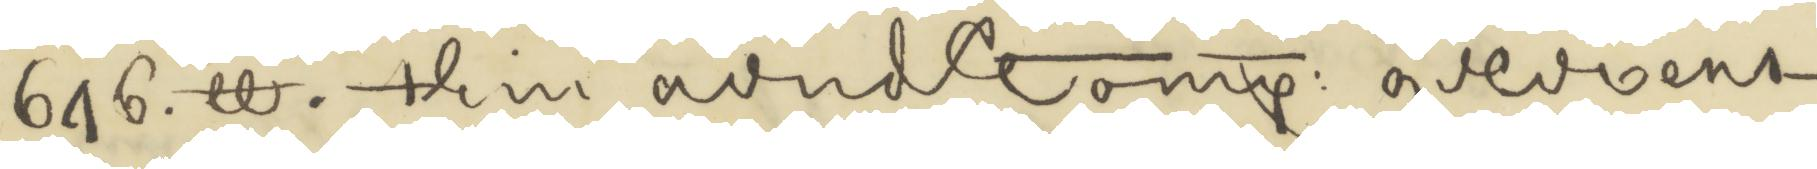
646. lb. thin aen dE Comp: gelevert
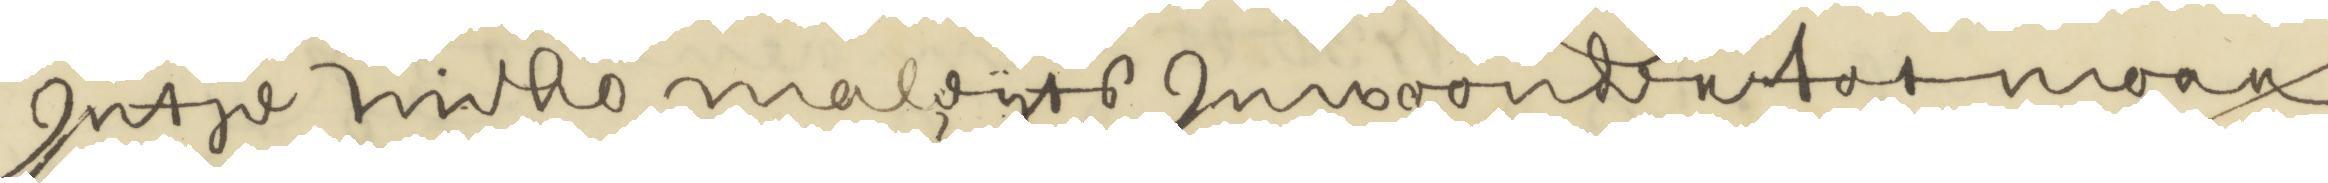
jntje nieko maleijts jnwoonder tot moar
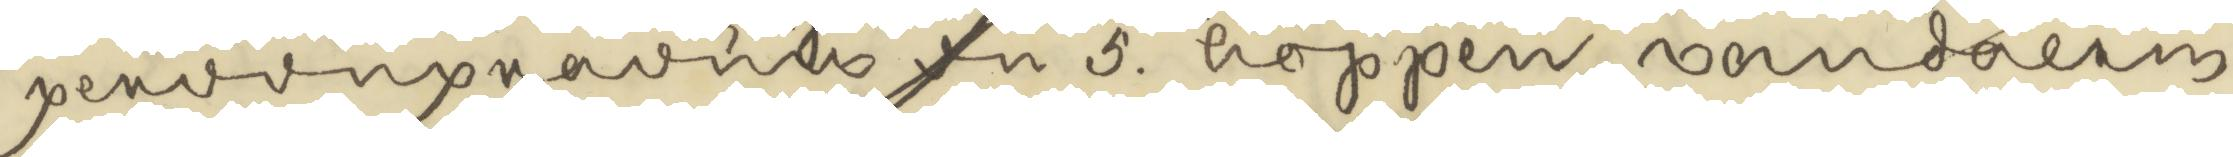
per een praeuw en 5. koppen van daer in
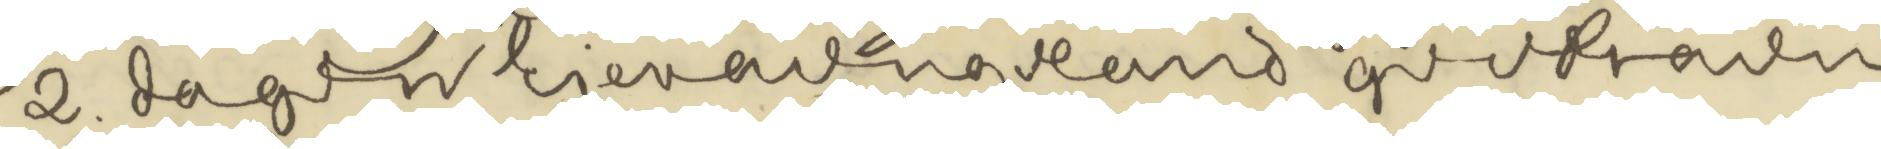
2. dagen hier aengeland geeft aen
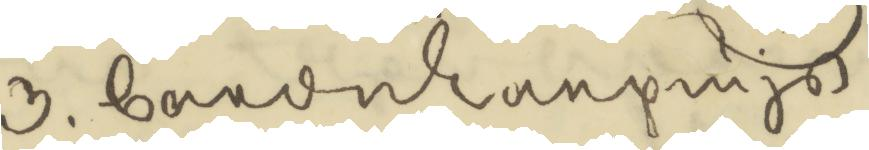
3. baren harpuijs
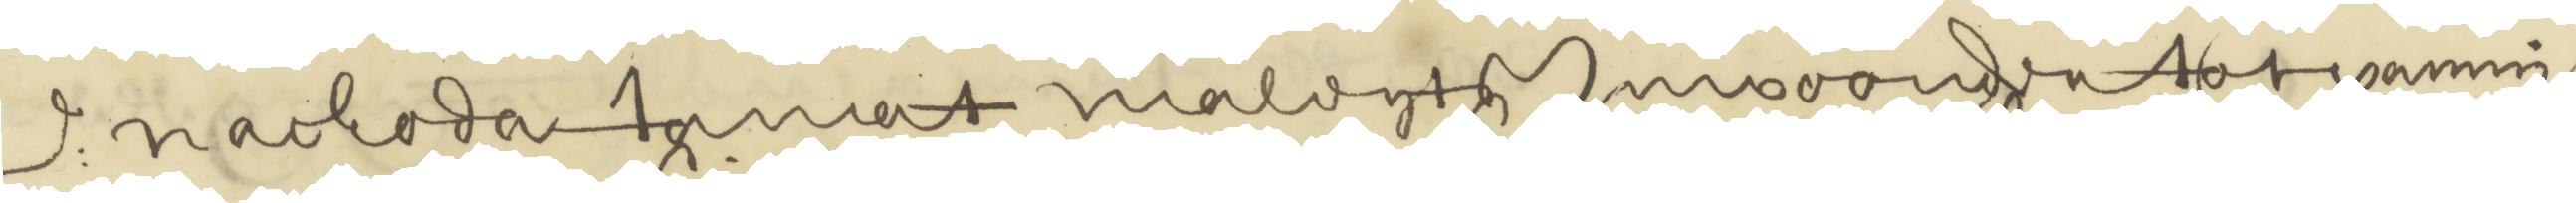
29. _:o nachoda tamat maleijts jnwoonder tot pannij
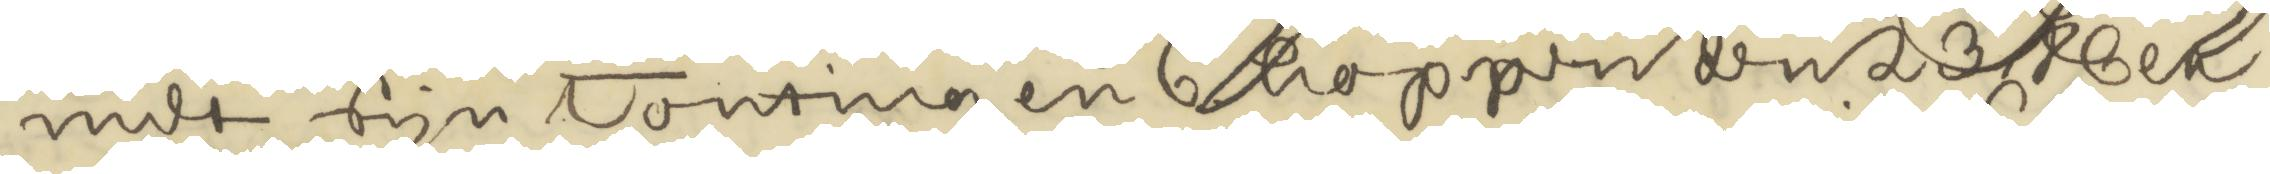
met sijn Conting en 6 koppen den 23. 8ber
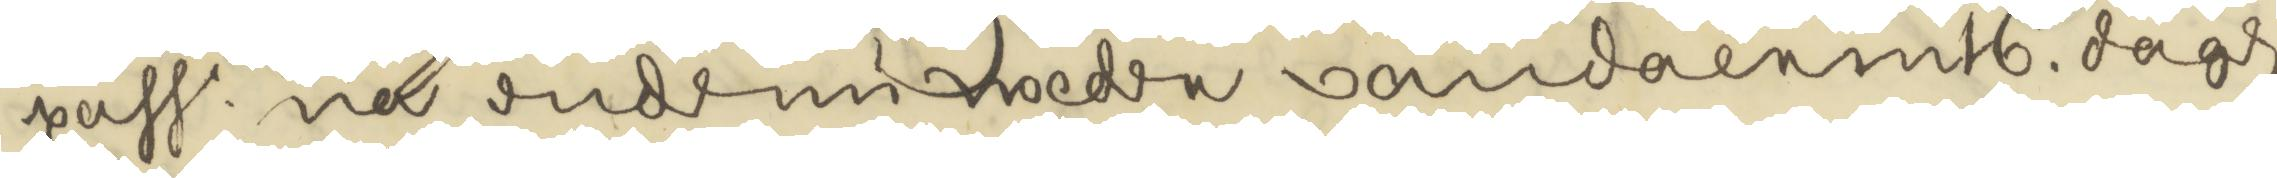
pass.o na ende nu weder van daer in 16. dagen
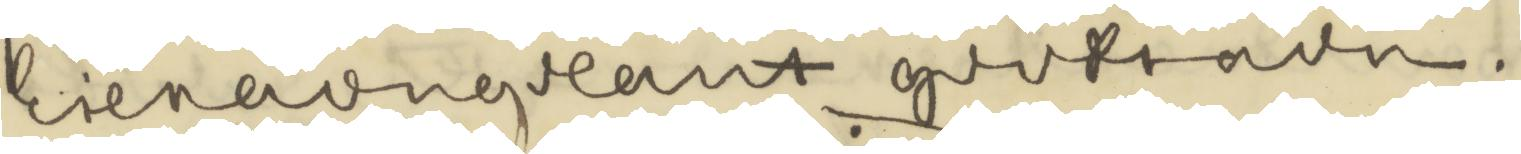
hier aengelant geeft aen.
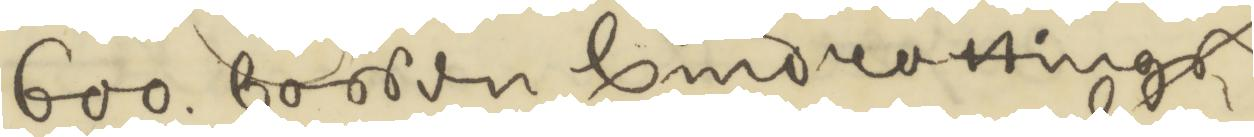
600. bossen bindrottings
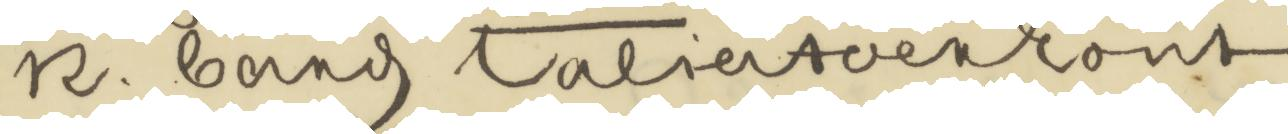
12. baren Caliatoerhout
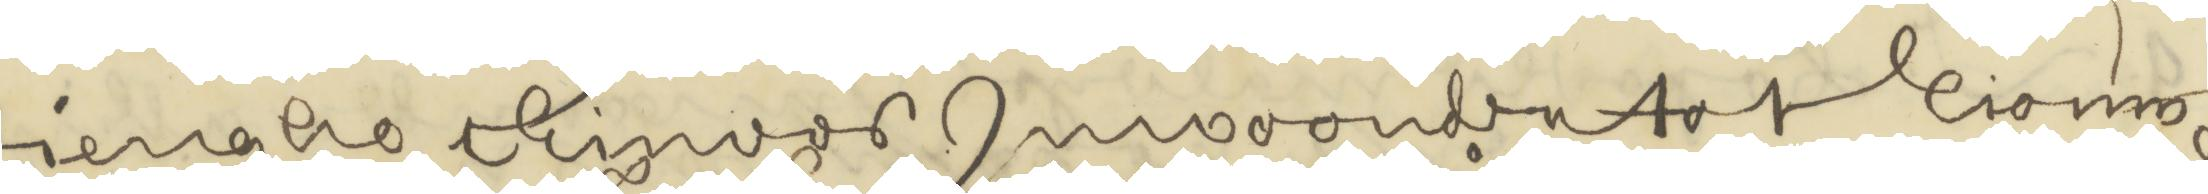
soetiengko chinees inwoonder tot riouw
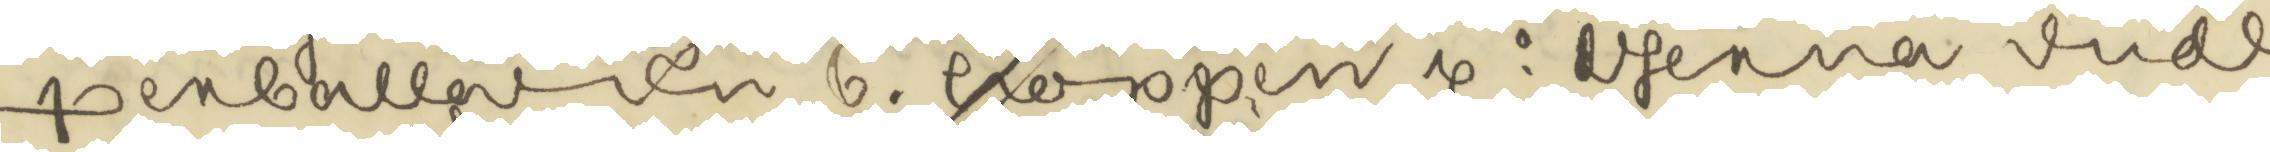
per balloe En 6. koppen p.o deser na ende
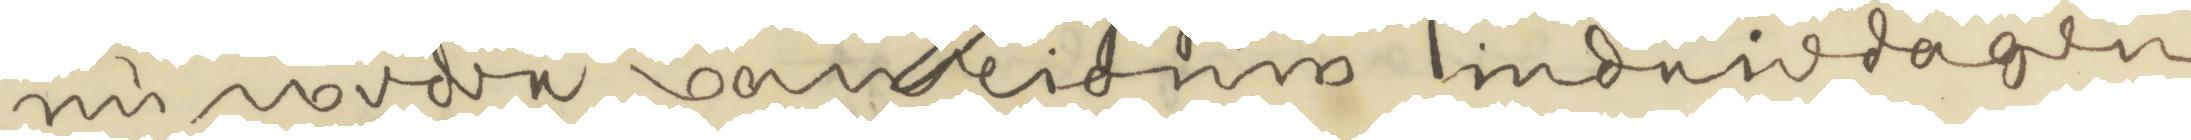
nu weder van riouw in drie dagen
